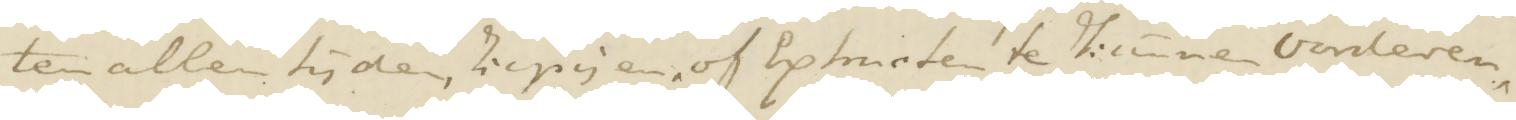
ten allen tijden kopijen, of Extracten te kunnen vorderen,
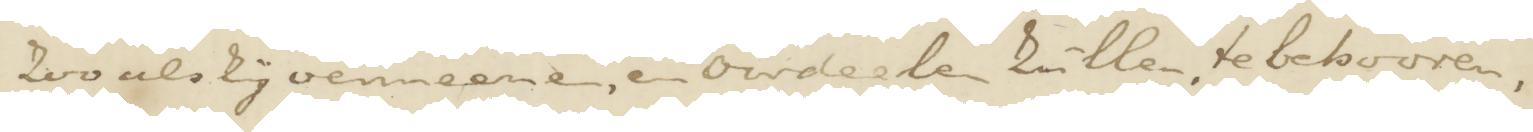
zoo als zij vermeenen, en oordeelen zullen, te behooren,
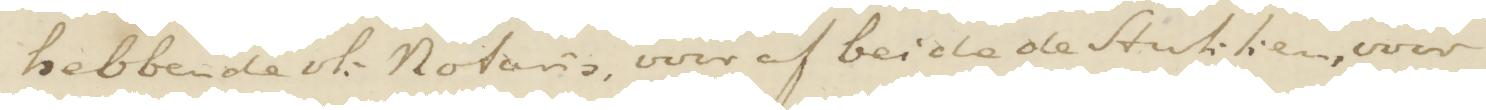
hebbende ik Notaris, voor af beide de stukken, voor
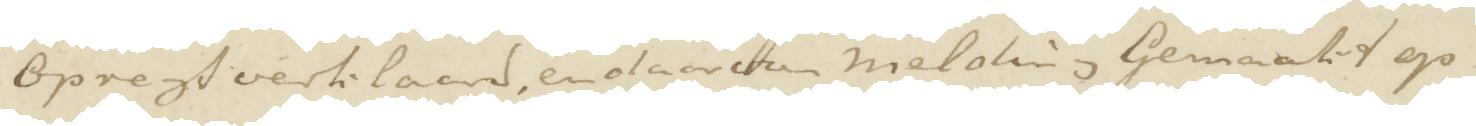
Opregt verklaard, en daarvan melding Gemaakt op
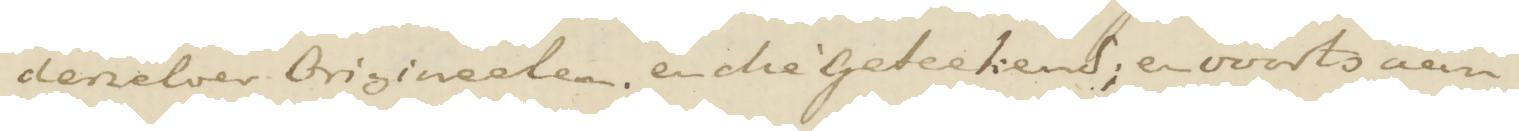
dezelver Origineelen. en die geteekend; en voorts aan
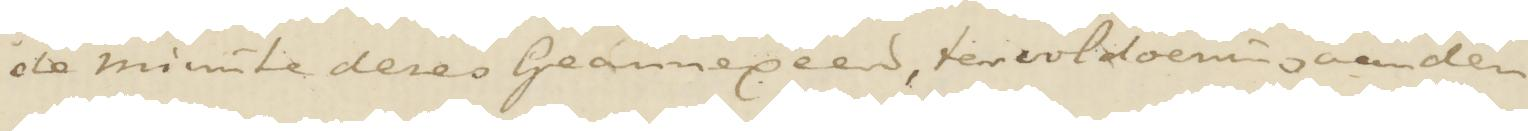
de minute dezes Geannexeerd, ter voldoening aan den
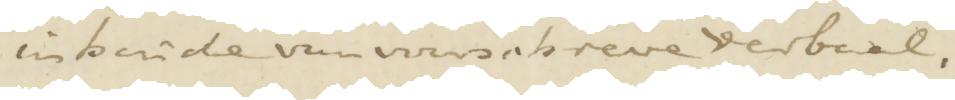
inhoude van voorschreve verbaal,
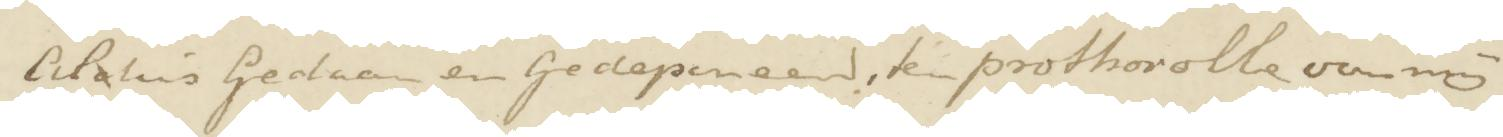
Aldus Gedaan en Gedeponeerd, te prothocolle van mij
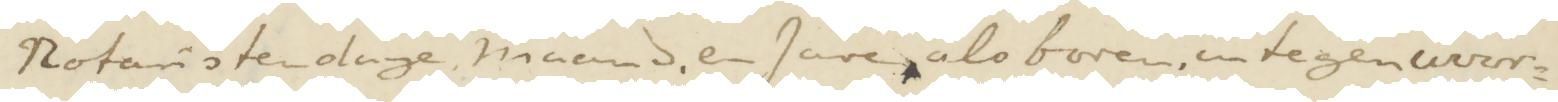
Notaris ten dage, maand, en Jare als boven, in tegenwoor=
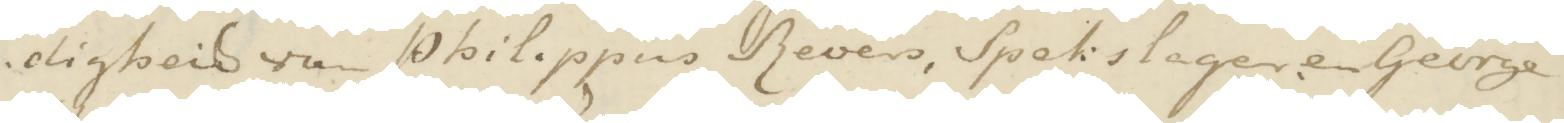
.digheid van Philippus Revers, Spekslager en George
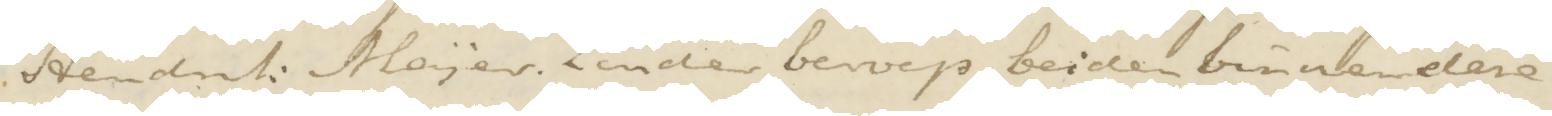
Hendrik Meijer. Zonder beroep, beiden binnen deze
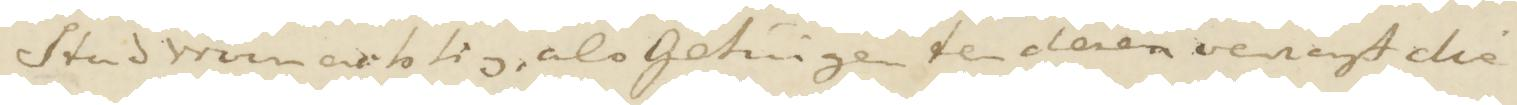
stad woonachtig, als getuigen ten dezen verzogt die
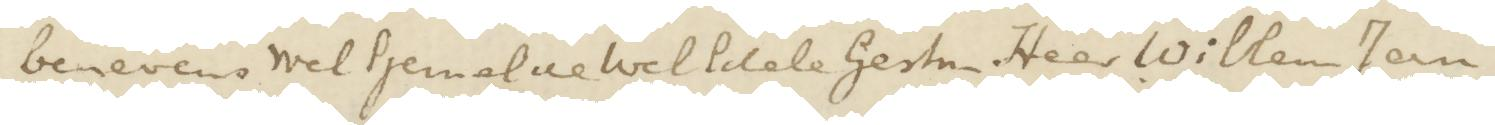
benevens wel Gemelde wel Edele Gestr Heer Willem Jan
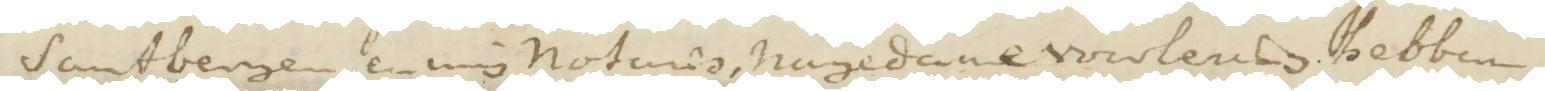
santbergen, en mij Notaris, nagedane voorlezing. hebben
